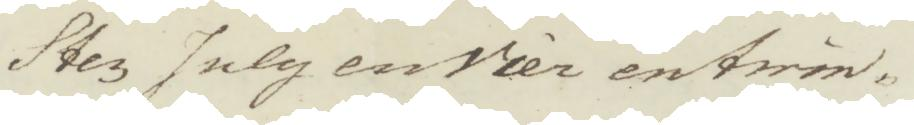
sten July en vier en twin„
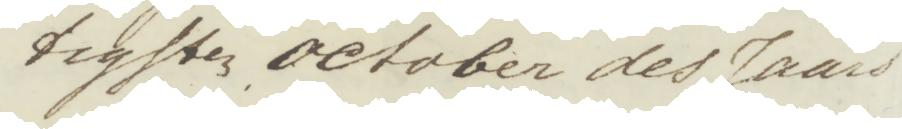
tigsten October des Jaars
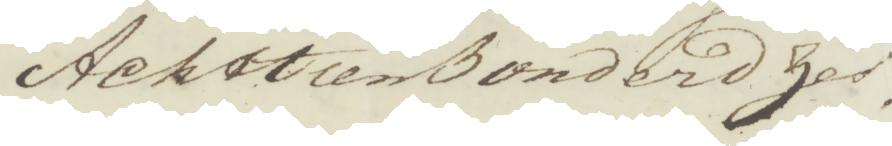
Achttienhonderd zes
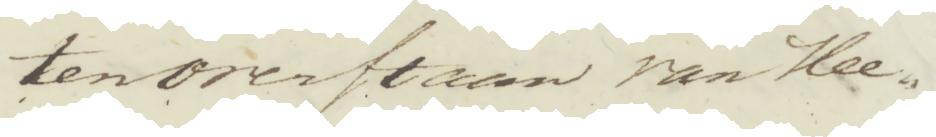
ten overstaan van Hee„
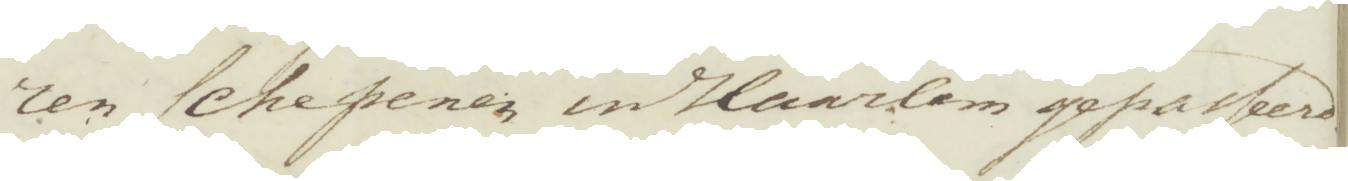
ren schepenen in Haarlem gepasseerd
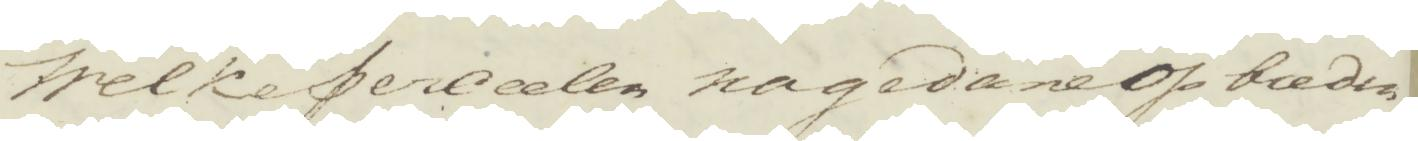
welke perceelen nagedane op biedin„
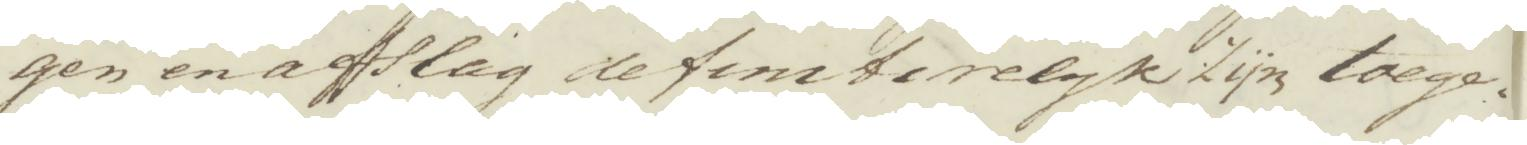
gen en affslag definitivelyk zijn toege„
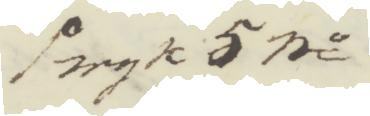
/ wyk 5 N=o
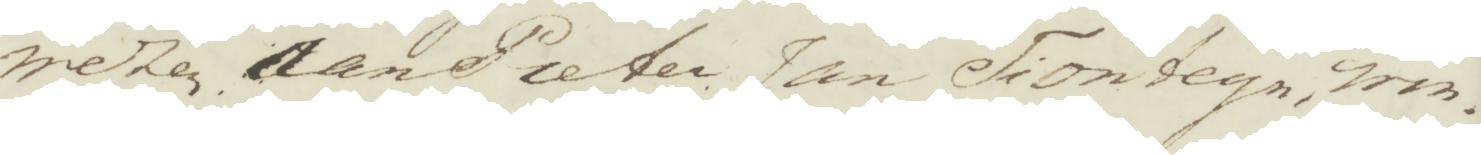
wezen aan Pieter Jan Fionteyn, win„
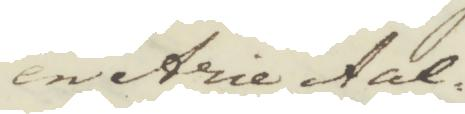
en Arie Aal„
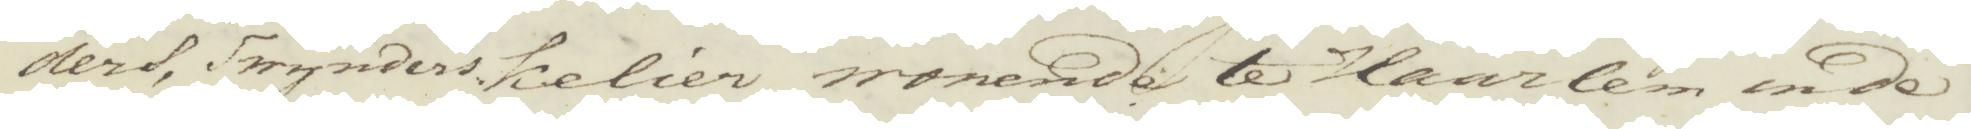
ders, Twynders„ kelier, wonende te Haarlem in de
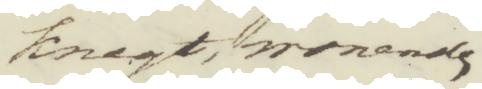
knegt, wonende
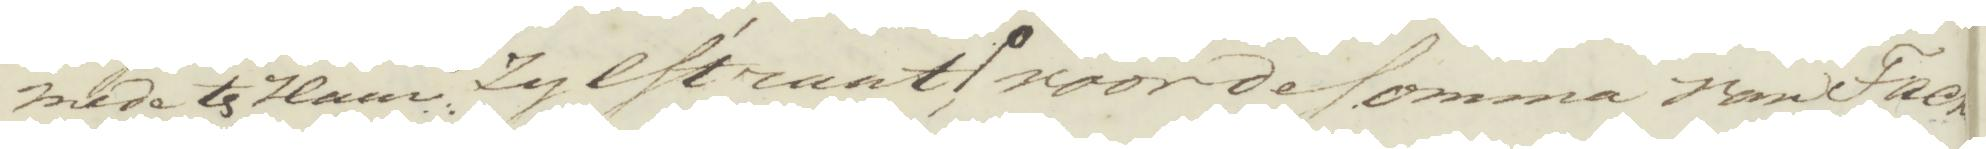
mede te Haar„ zylstraat, / voor de somma van Tac
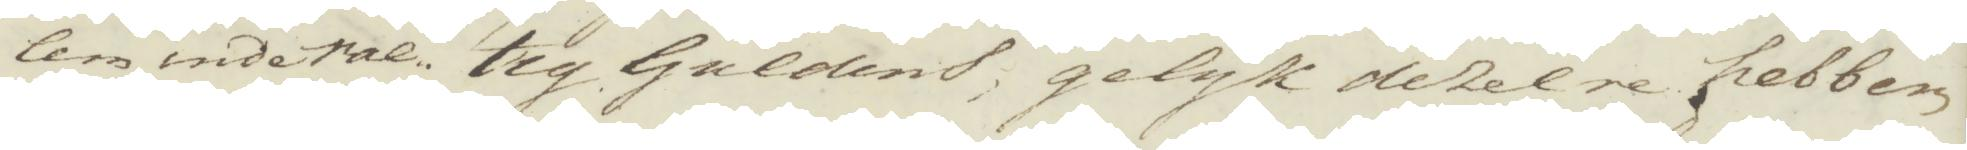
lem in de val„ tig Guldens, gelyk dezelve hebben
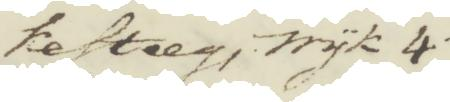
kesteeg, wijk 4
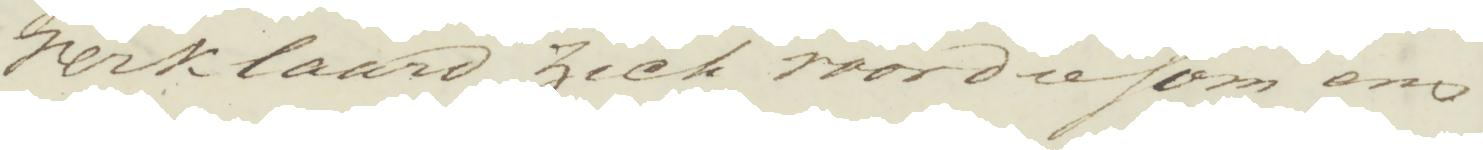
verklaard zich voor die som en
